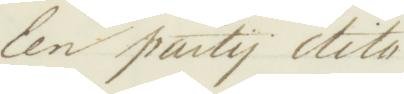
Een partij dito
